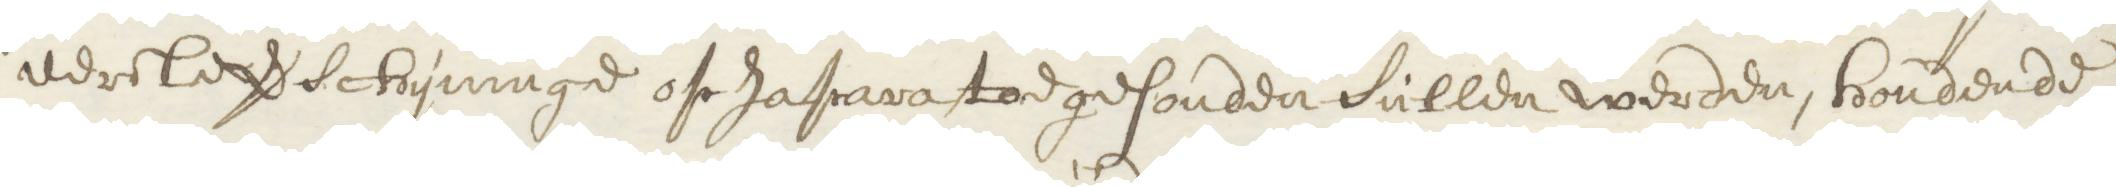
eerste verschijninge op Japara toegesonden sullen werden, houdende
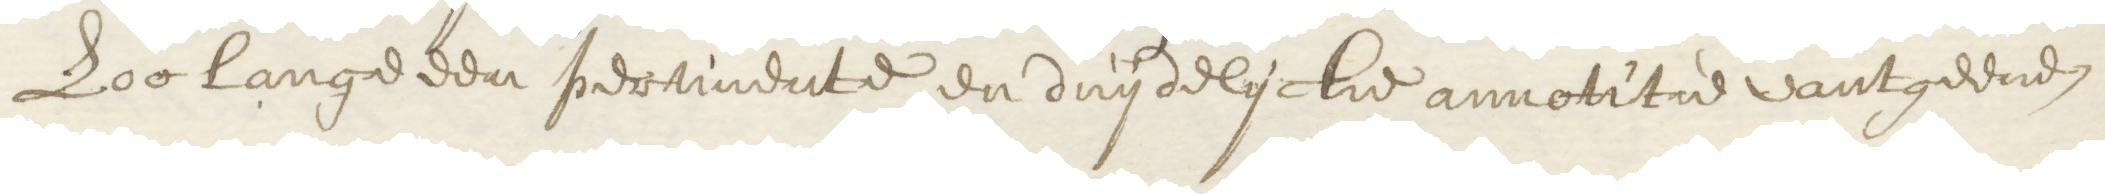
zoo lange een pertinente en duijdelijcke annotitie vant geenen
